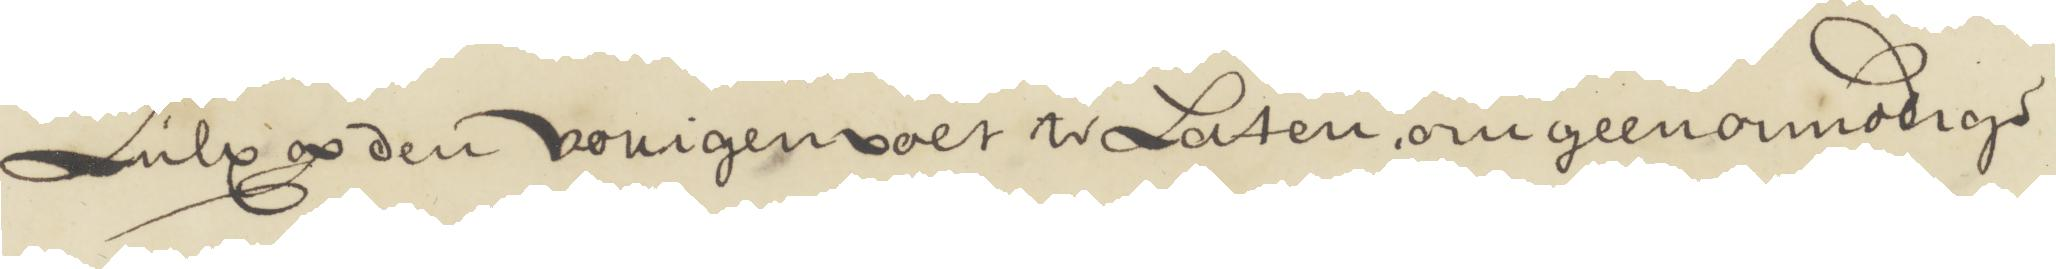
zulx op den vorigen voet te Laten, om geen onnodige
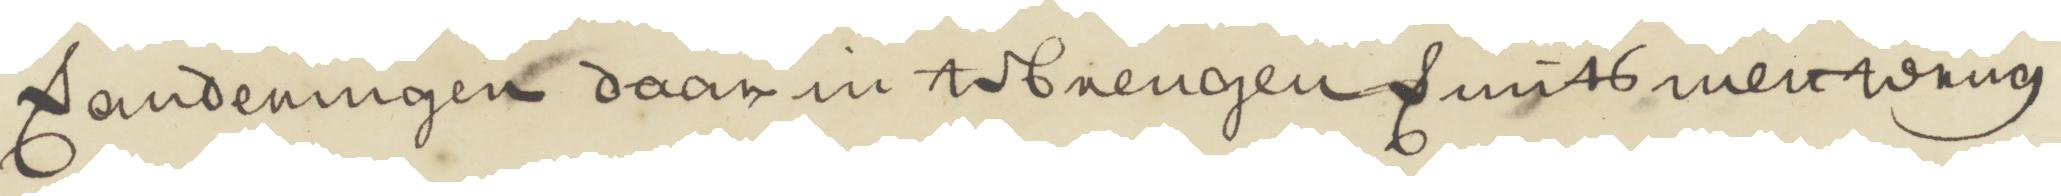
veranderingen daar in tebrengen vermits men terug
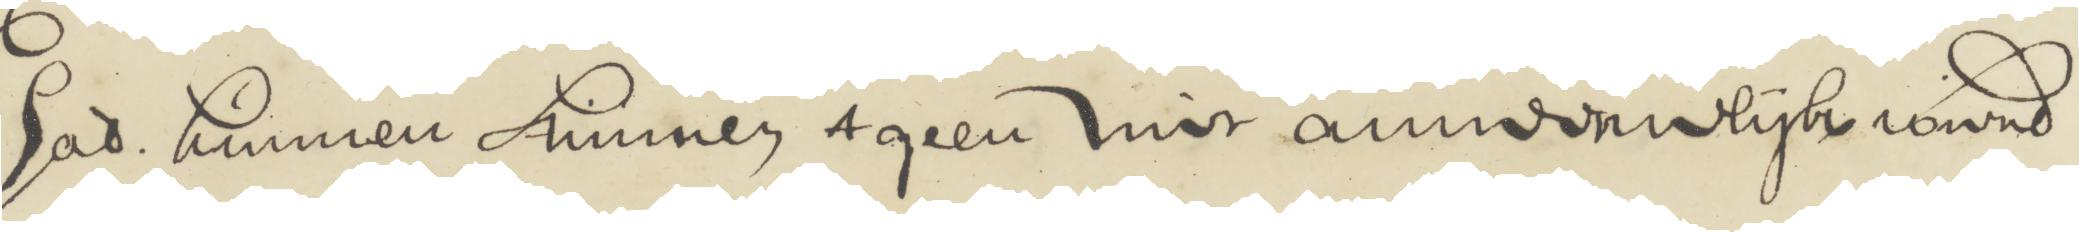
had kunnen stuuren t geen Niet anneemelijk wierd
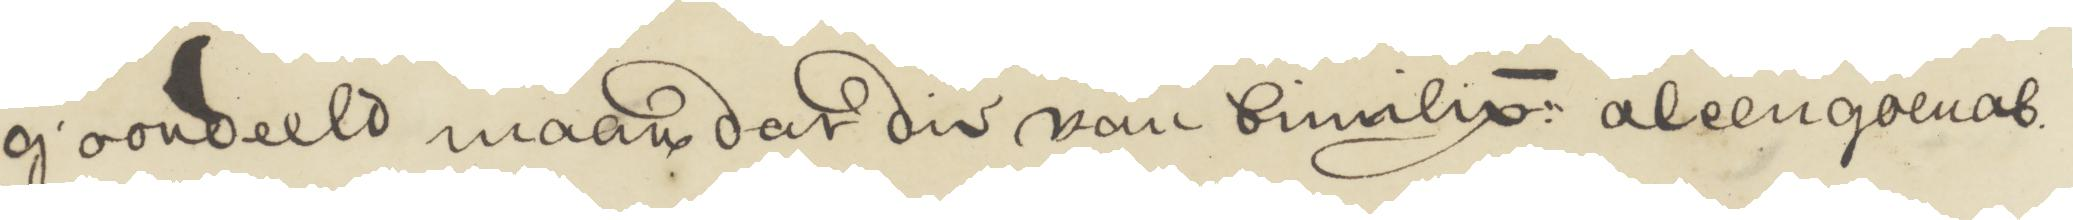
g'oordeeld maar dat die van bimilip: al een goenab
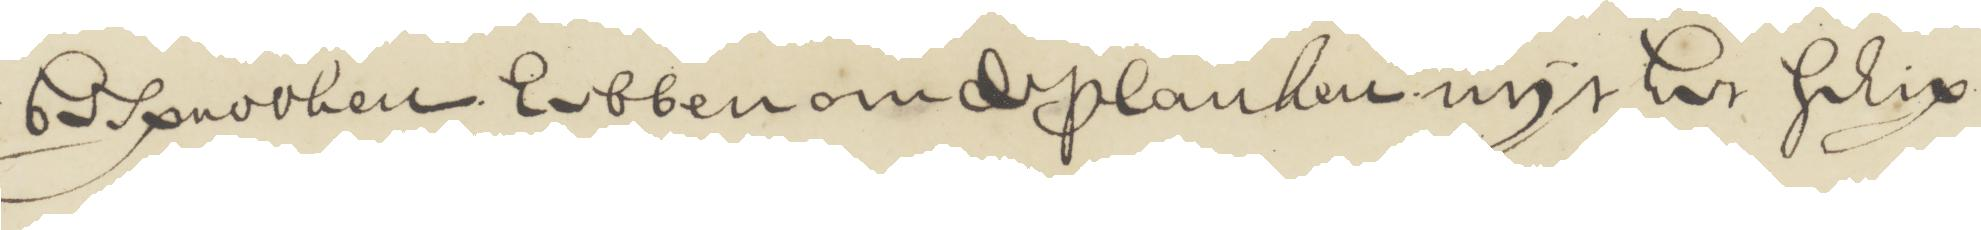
besprooken hebben om de planken uijt het schip
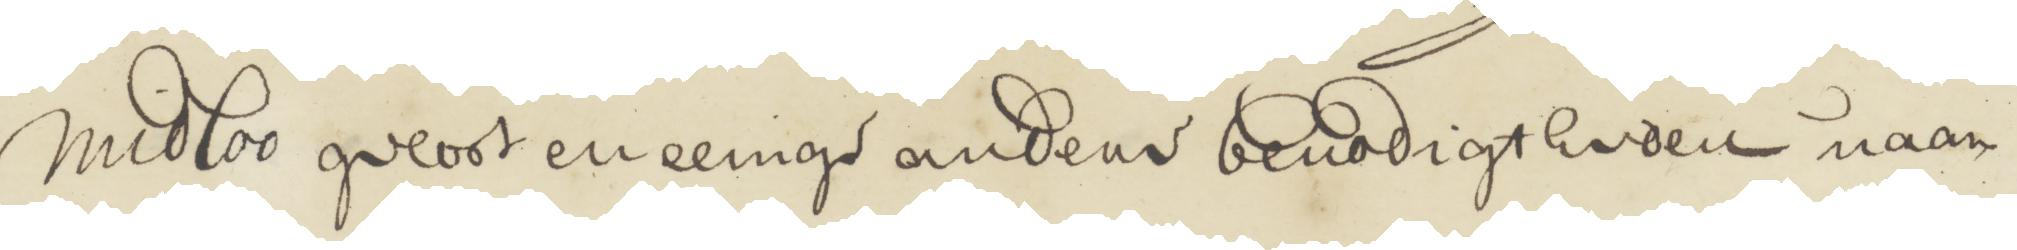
Midloo gelost en eenige andere benodigtheden naar
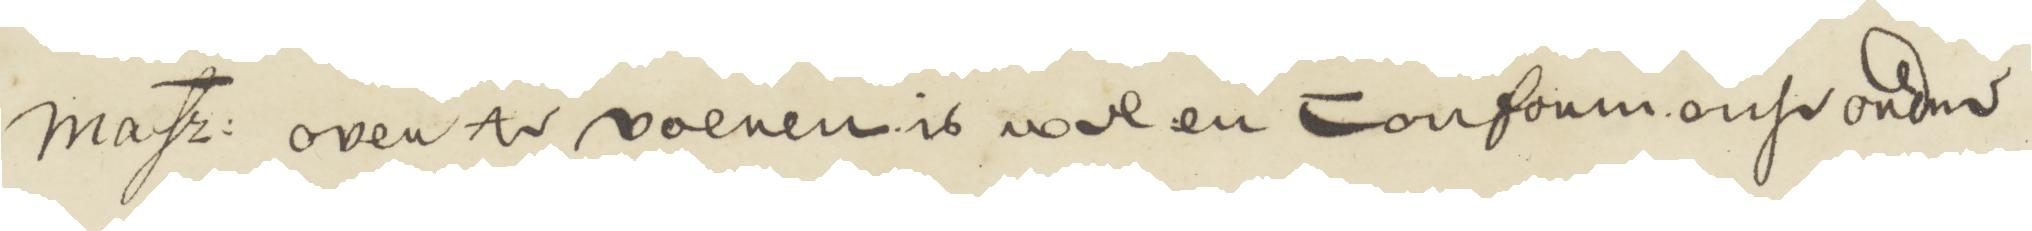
Masz: over te voeren is wel en Conform onse ordre
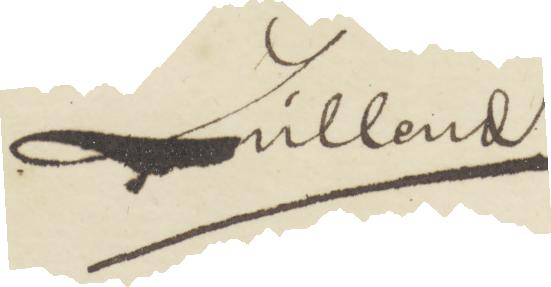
zullende
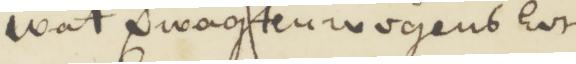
wat verwagten wegens het
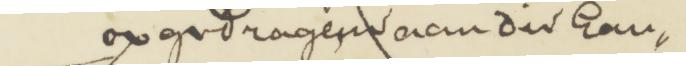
op gedragene aan die han„
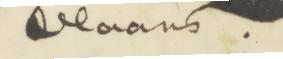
delaars.
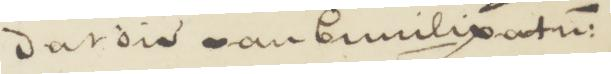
dat die van bimilipatn:
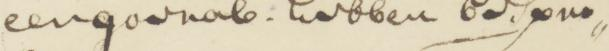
eengoenab: hebben bespro„
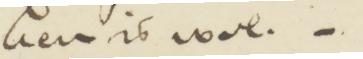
ken is wel. — .
